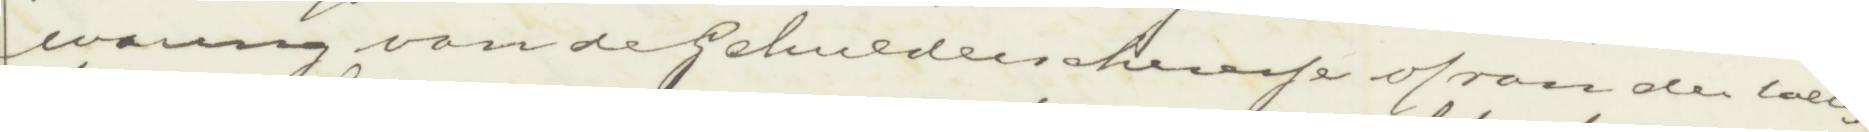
waring van de Schuldeischeresse of van den wet„
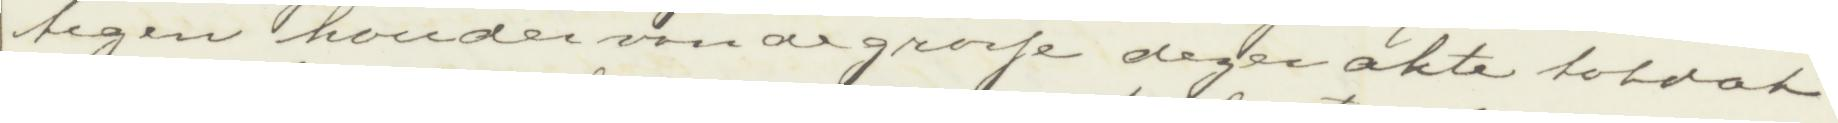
tigen houder van de grosse dezer akte totdat
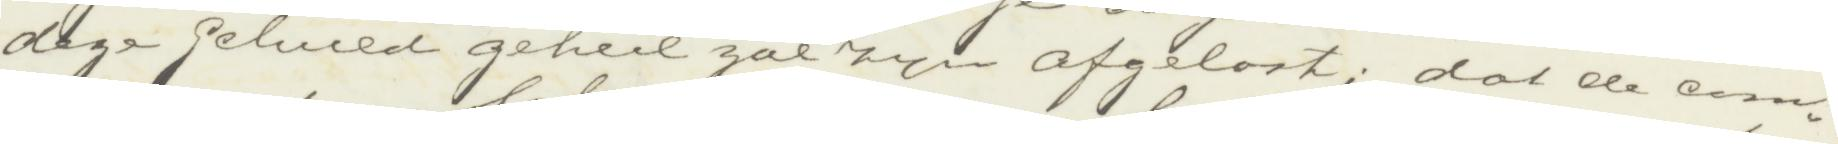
deze Schuld geheel zal zyn afgelost; dat de com„
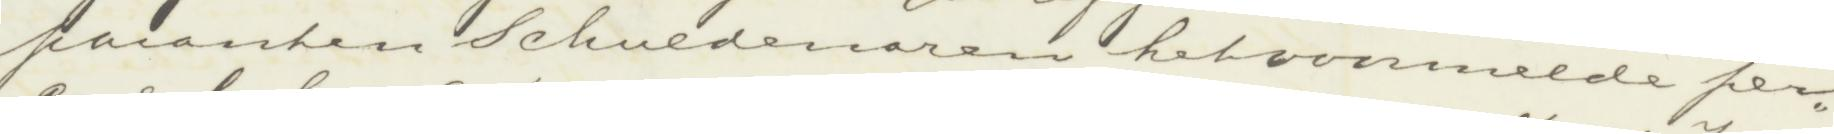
paranten schuldenaren het voormelde per„
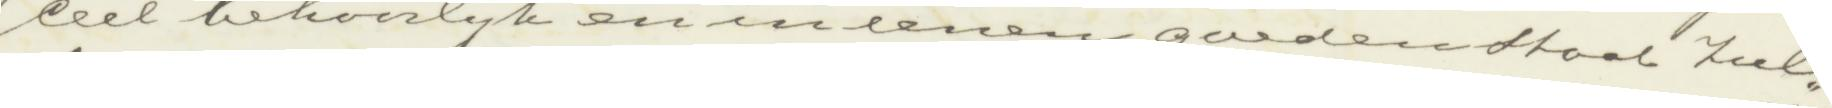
ceel behoorlyk en in eenen goeden staat zul„
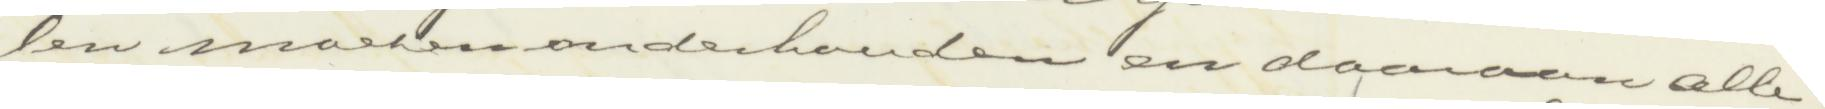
ten moeten onderhouden en daaraan alle
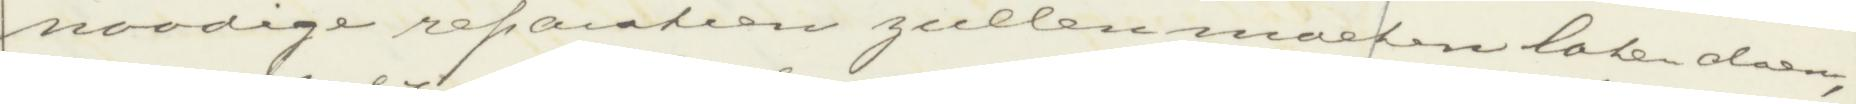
noodige reparatien zullen moe|ten laten doen,
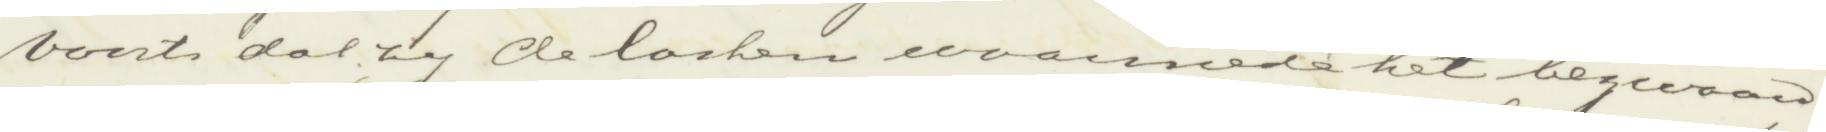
voorts dat zy de losten waarmede het bezwaard
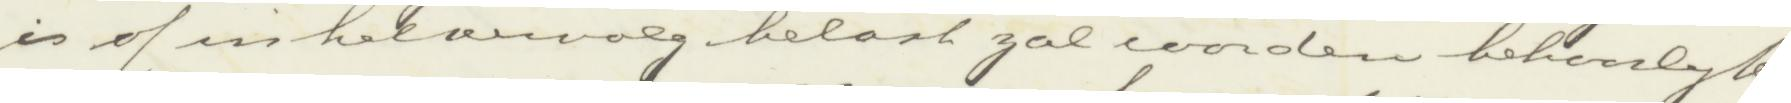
is of in het vervolg belast zal worden behoorlyk
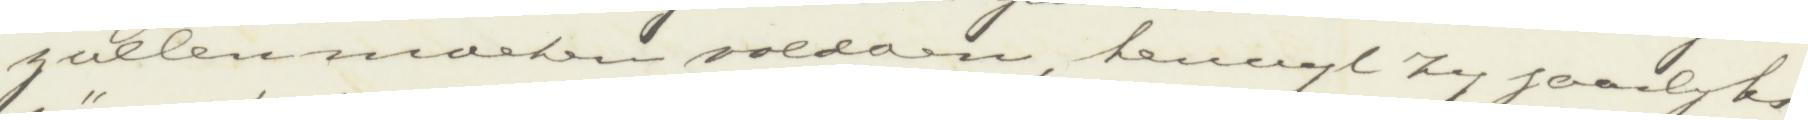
zullen moeten voldoen, tenwyl zy jaarlyks
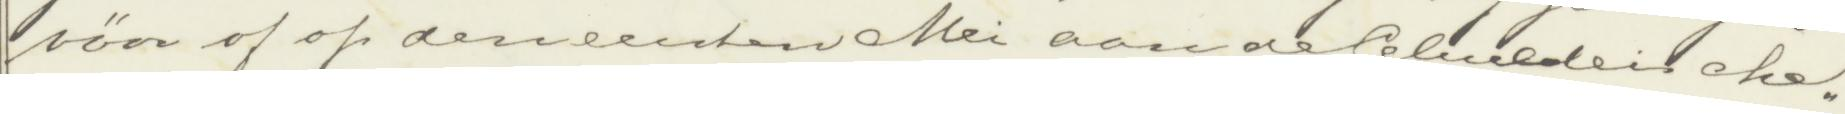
vöor of op den eersten Mei aan de Schuldeische„
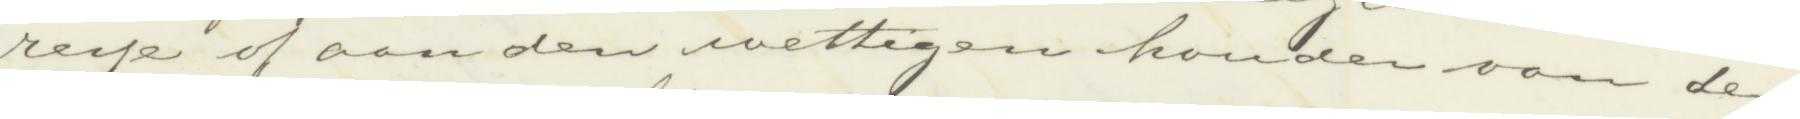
resse of aan den wettigen houder van de
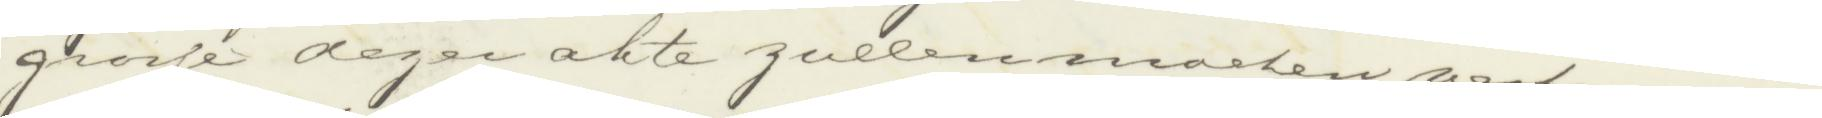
grosse dezer akte zullen moeten vertoonen
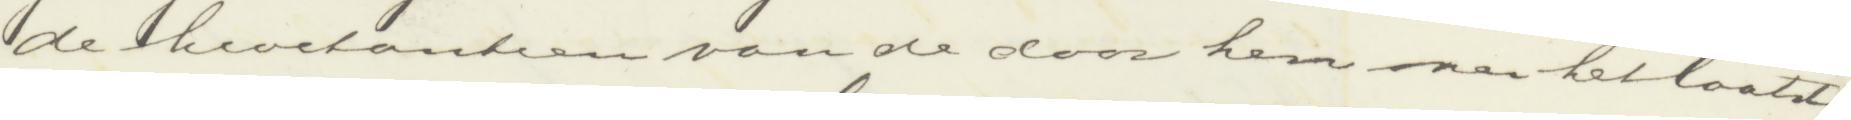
de kwitantien van de door hem over het laatst
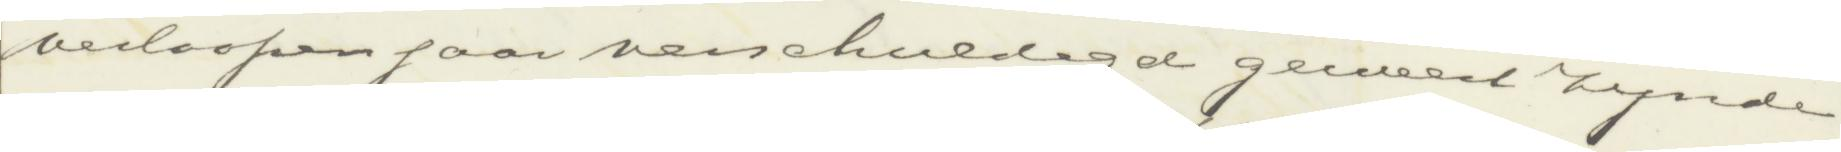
verloopen jaar verschuldigd geweest zynde
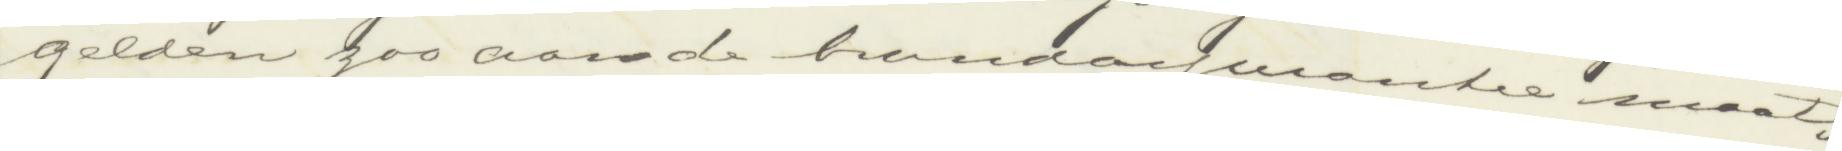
gelden zoo aan de brandassurantie maat„
